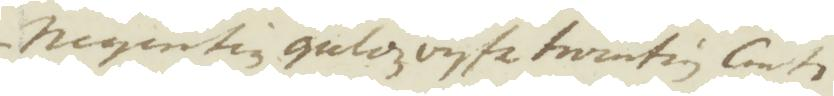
negentien gulden vyf en twintig Cents
